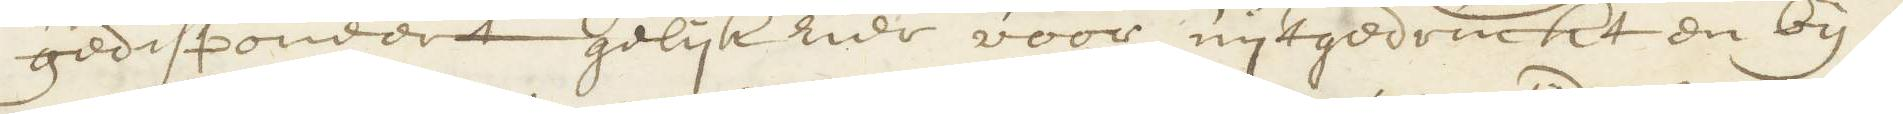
gedisponeert gelijk hier voor uijtgedruckt en bij
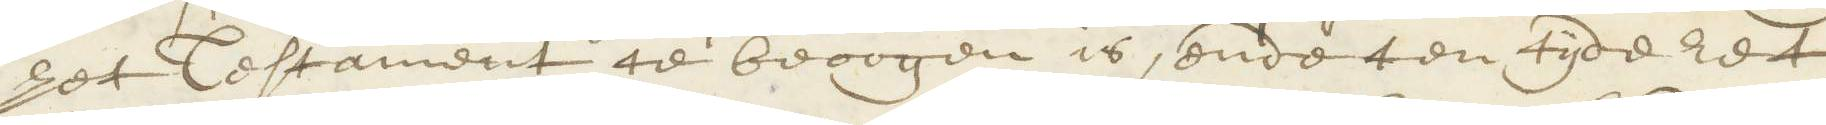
het Testament te beoogen is, ende ten tijde het
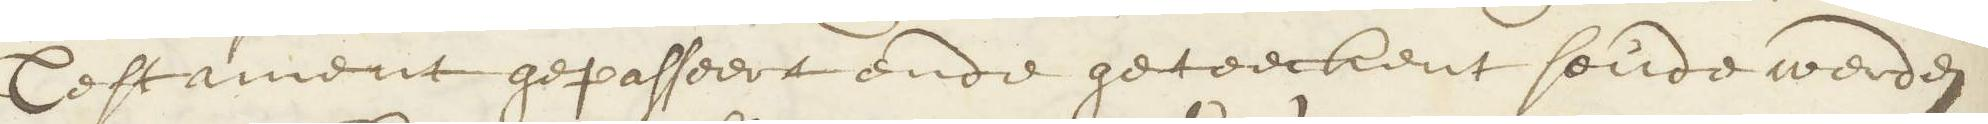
Testament gepasseert ende geteeckent soude werden
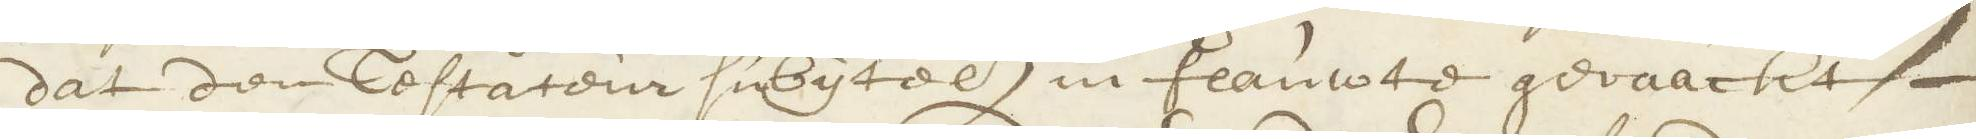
dat den Testateur subijtelijk in flauwte geraackt —
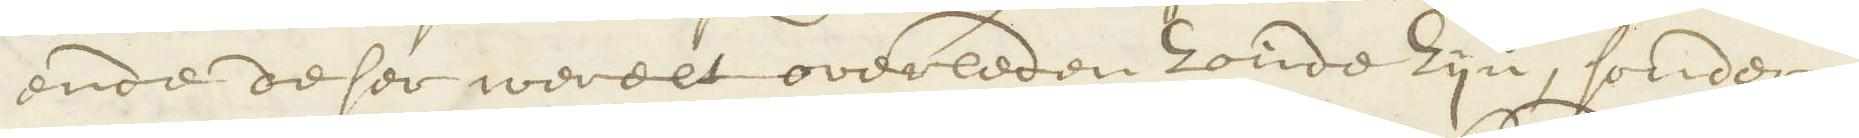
ende deser werelt overleden zoude zijn, sonder
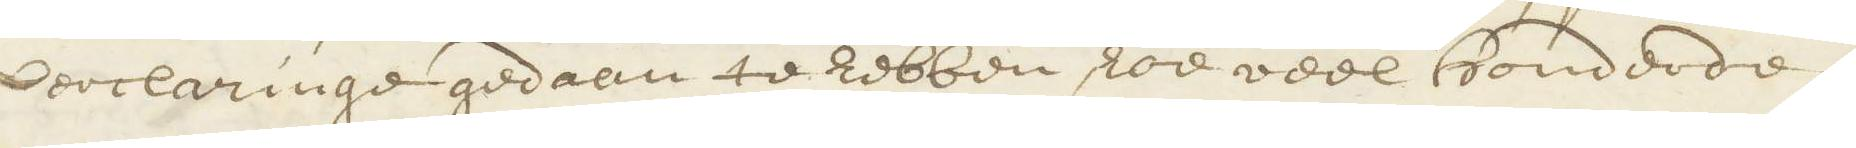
verclaringe gedaan te hebben hoe veel honderde
